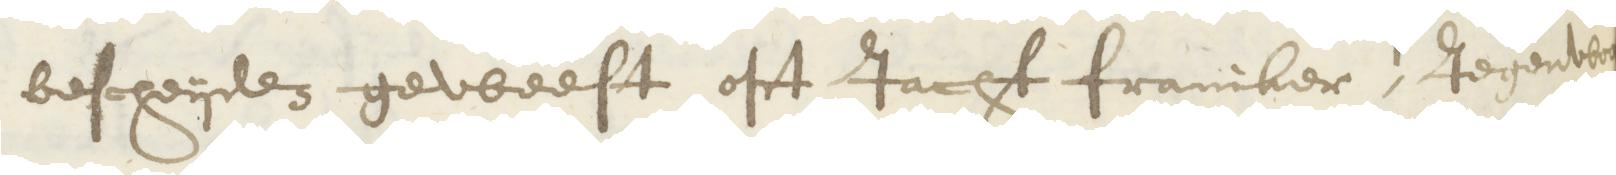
bescheijden geweest opt Jacht franiker; tegenwoo
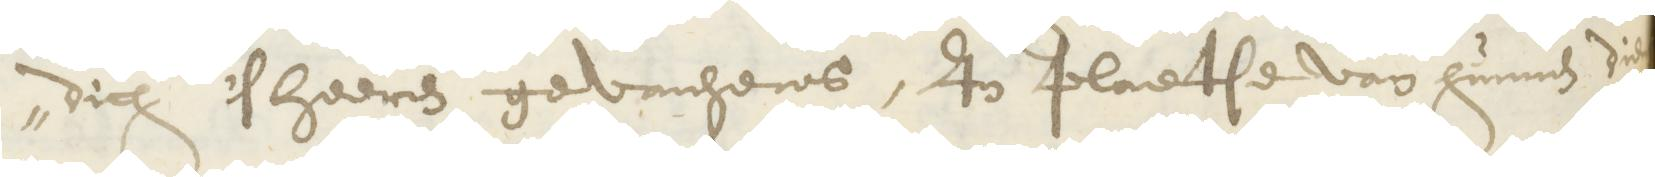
„dich 's heeren gevangens, Jn plaetse van hunnen die
